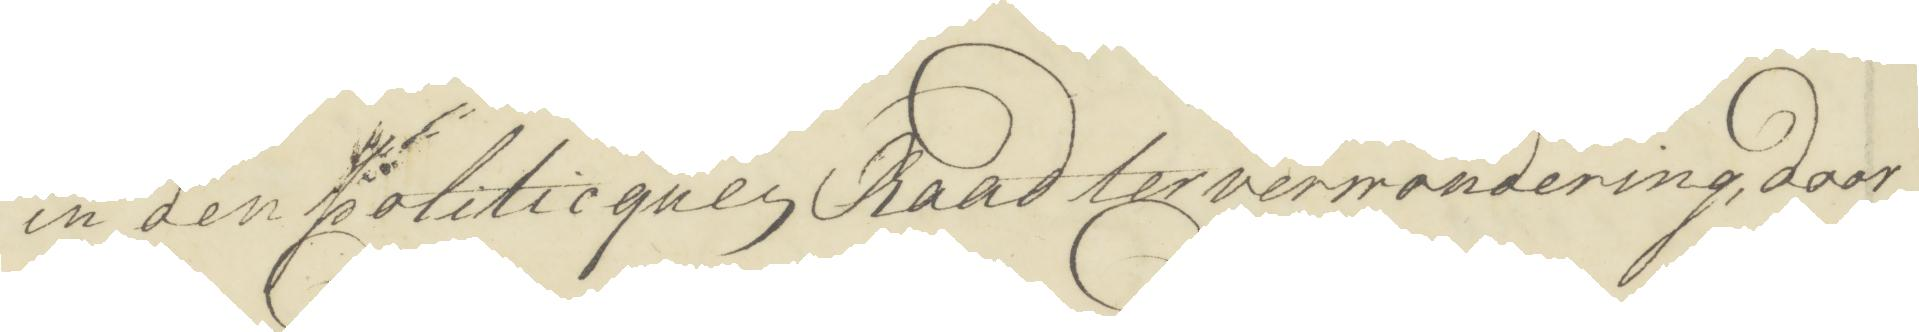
in den politicquen Raad ter verwondering, door
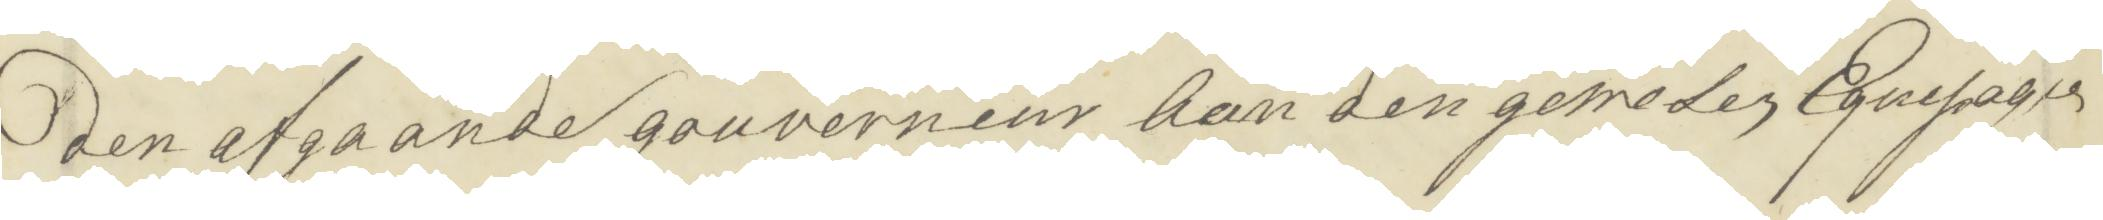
den afgaande gouverneur aan den gewesen Equipagien
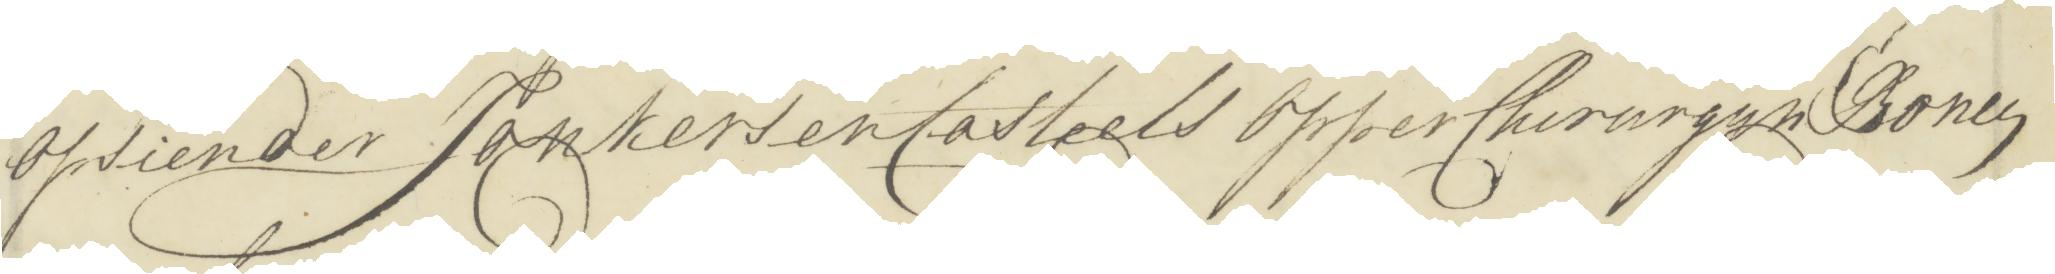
opsiender Jonkers en Casteels opperChirurgyn Bonen
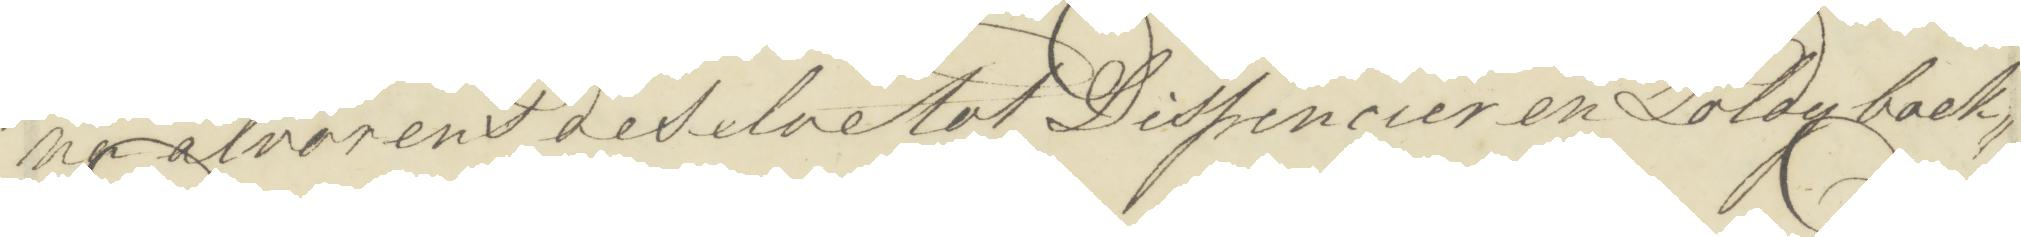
na alvorens deselve tot Dispencier en zoldyboek„
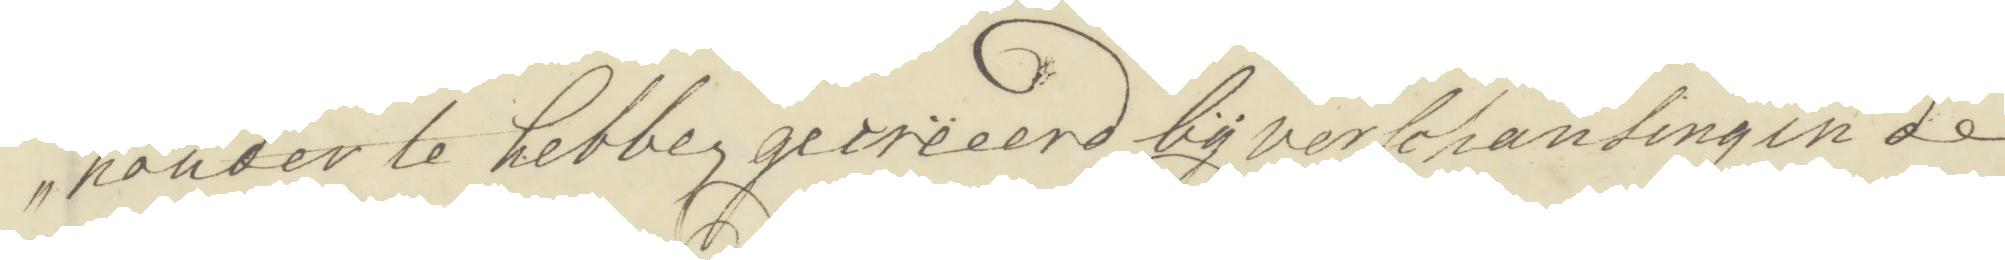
„houder te hebben gecrëeerd bij verschansing in de
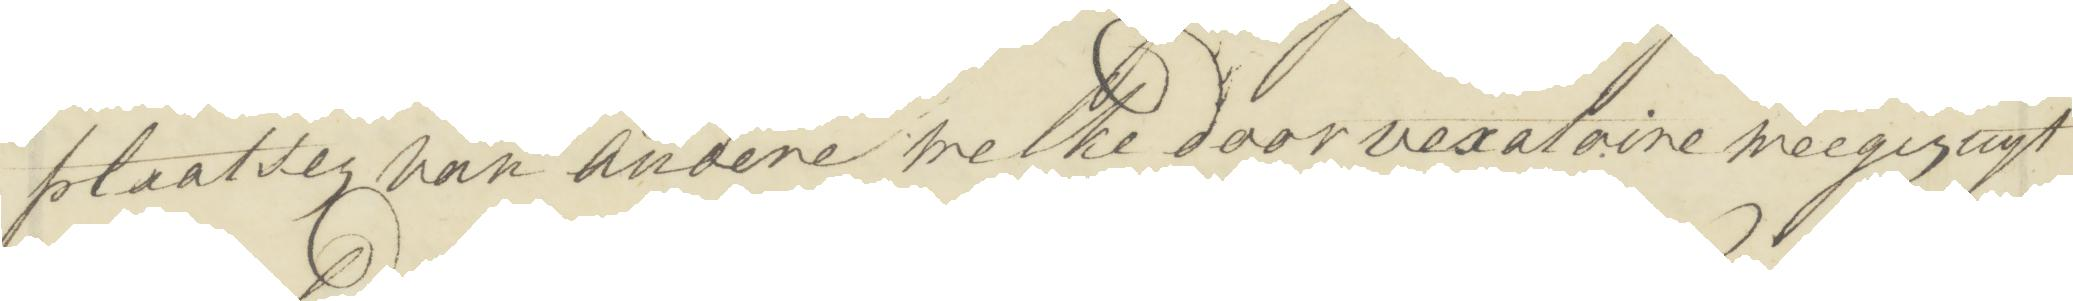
plaatsen van andere welke door vexatoire weegen uyt
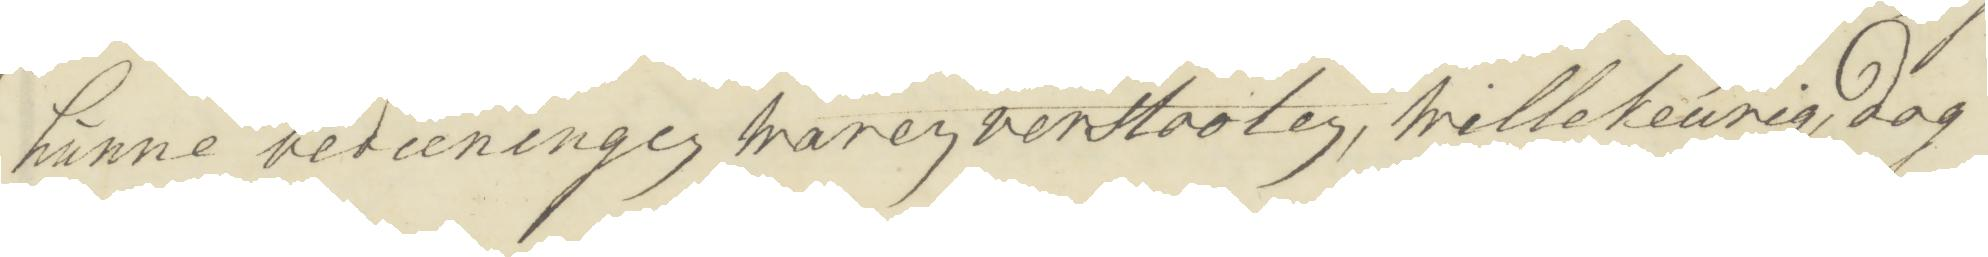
hunne bedieningen waren verstooten, willekeurig, dog
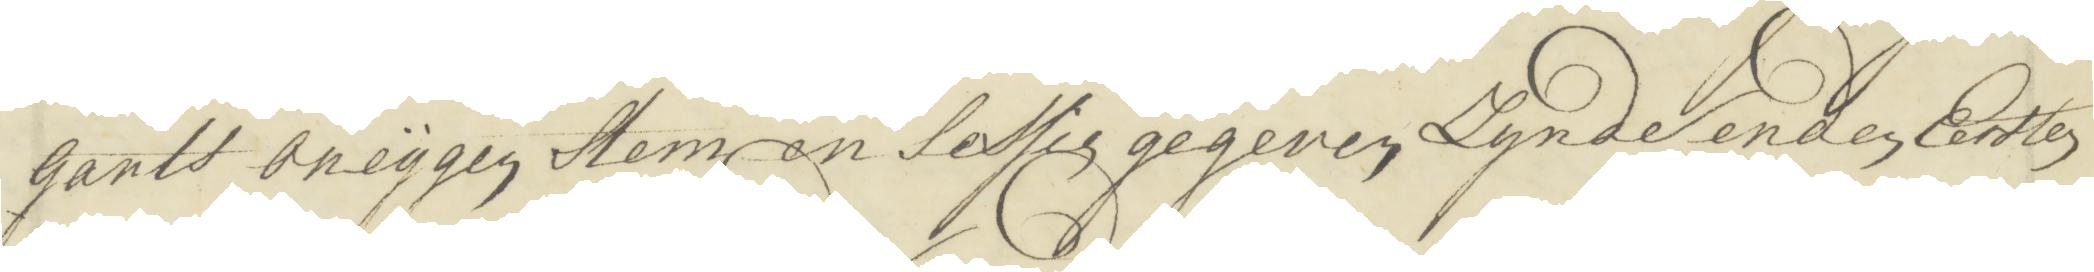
gants oneygen stem en sessien gegeven zynde enden Eersten
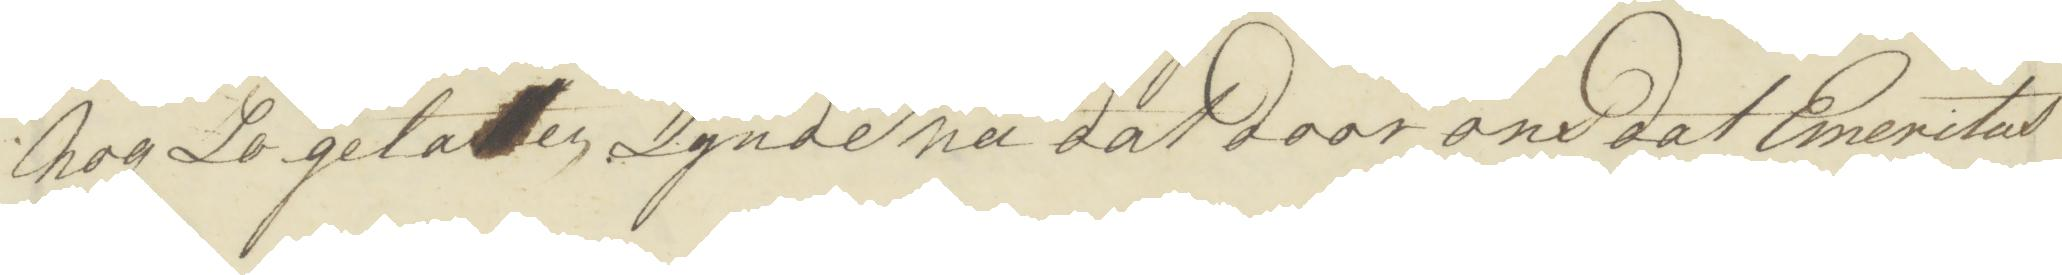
nog so gelaten, zynde na dat door ons dat Emeritas
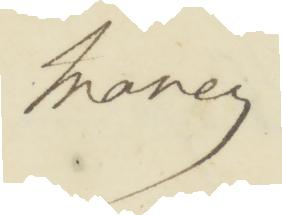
moren
